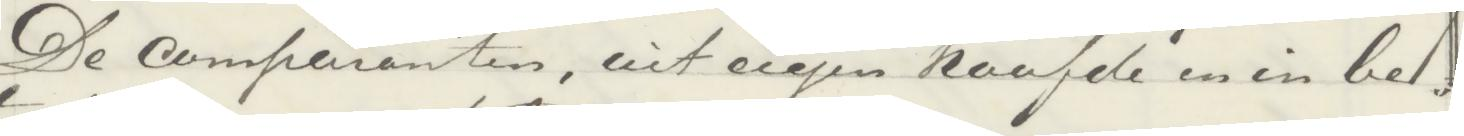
De Comparanten, uit eigen hoofde en in be„
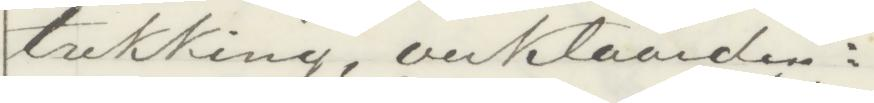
trekking, verklaarden:
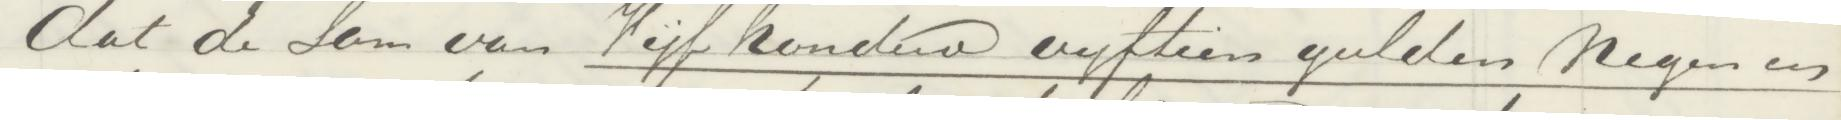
dat de som van Vijf honderd vyftien gulden Negen en
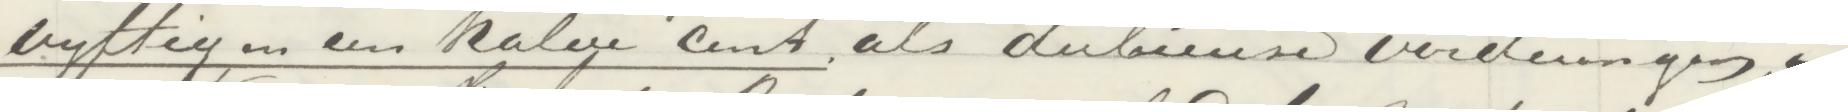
vyftig en een halve cent, als dubieuse vorderingen, on„
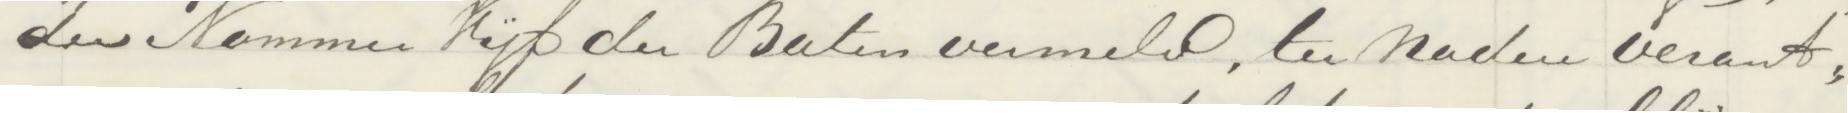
der Nommer Vijf der Baten vermeld, ter nader verant„
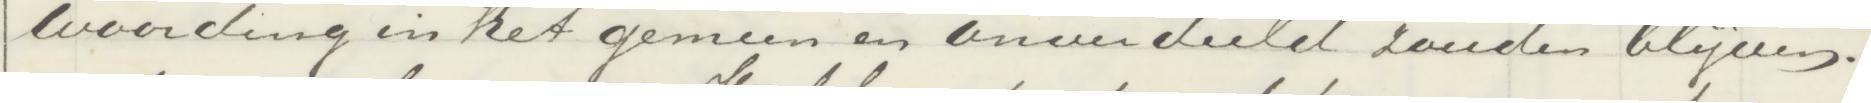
woording in het gemeen en onverdeeld zouden blijven.
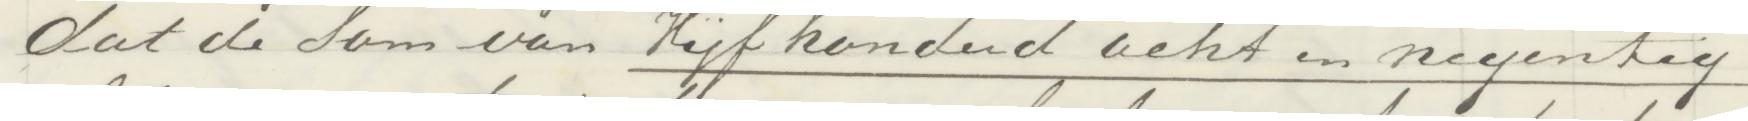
dat de som van Vijf honderd acht en negentig
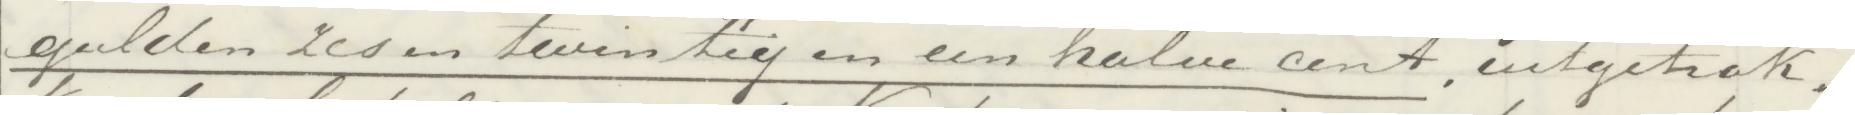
gulden zes en twintig en een halve cent, uitgetrok„
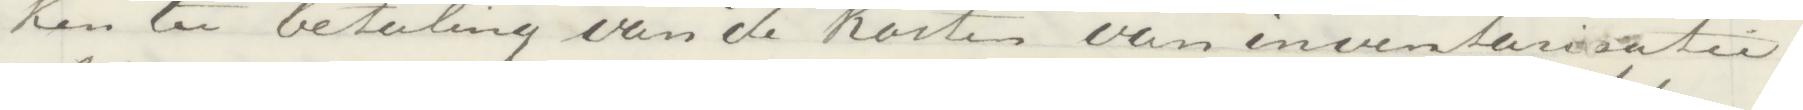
ken ter betaling van de kosten van inventarisatie
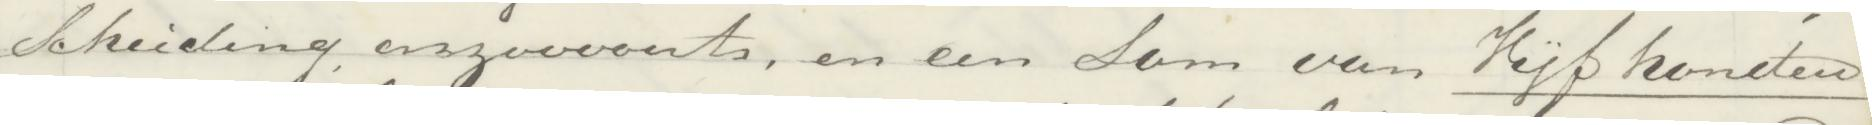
scheiding, enzoovoorts, en een som van Vijf honderd
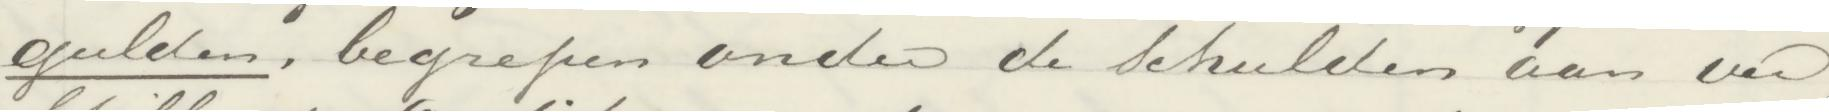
gulden, begrepen onder de schulden aan ver
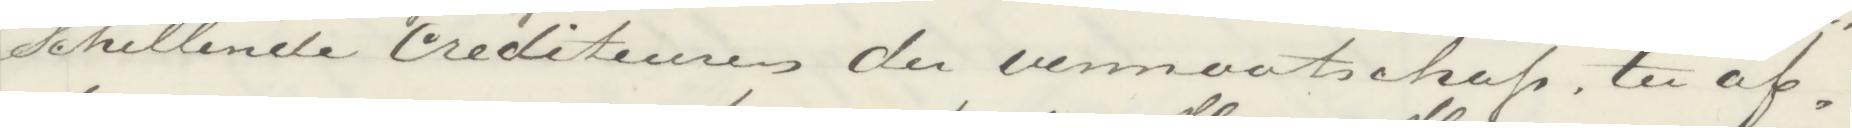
schillende Crediteuren der venootschap, ter af„
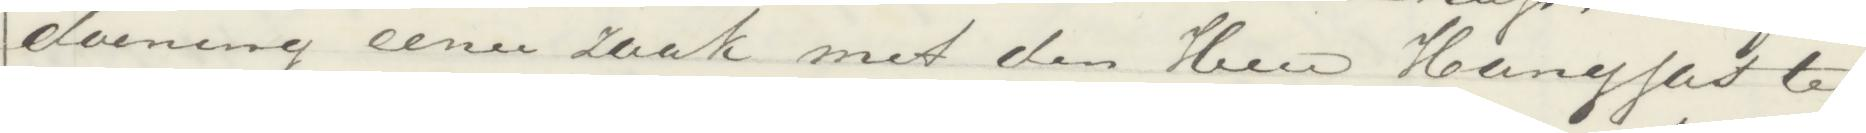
doening eene zaak met den Heer Hangjas te
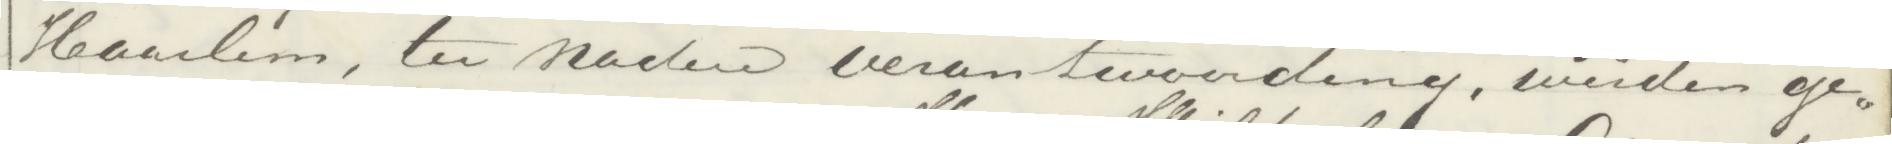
Haarlem, ter nadere verantwoording, werden ge„
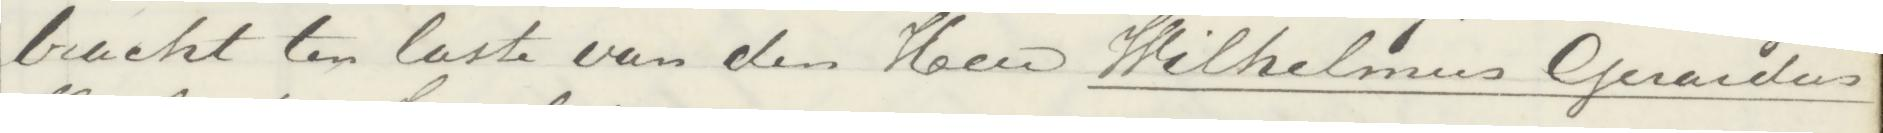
bracht ten laste van den Heer Wilhelmus Gerardus
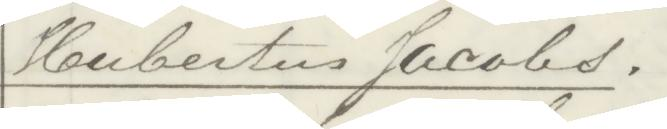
Hubertus Jacobs,
